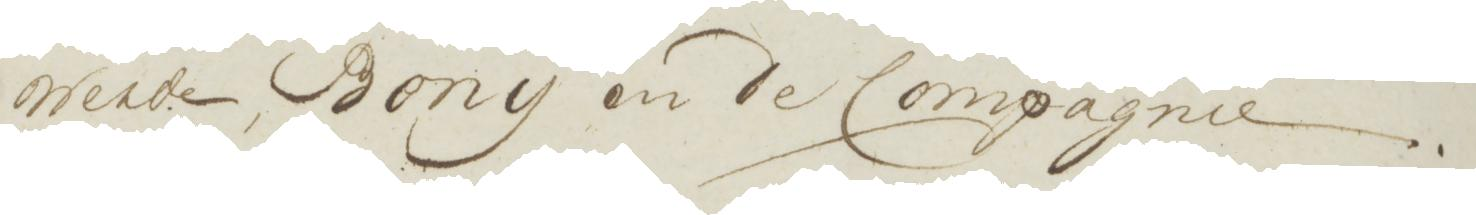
werde, Bonij en de Compagnie
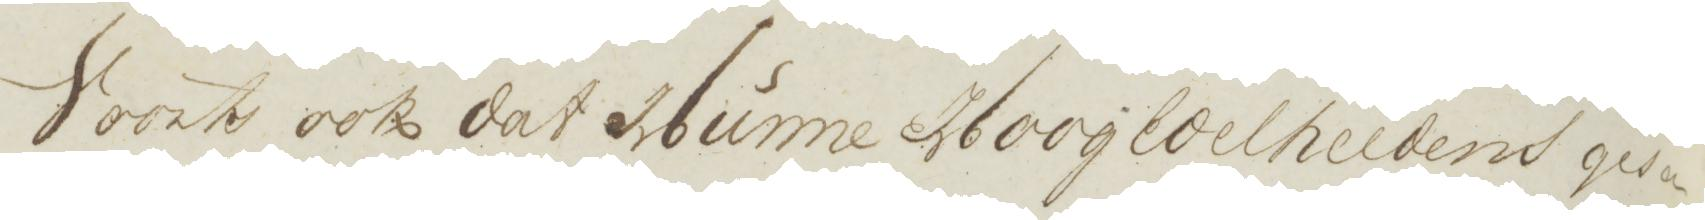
Voorts ook dat Hunne Hoog Edelheedens gesa
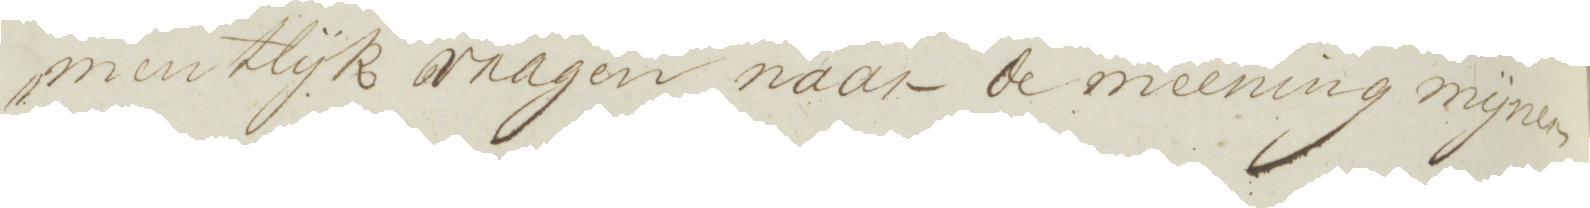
„mentlijk vragen naar de meening mijnen
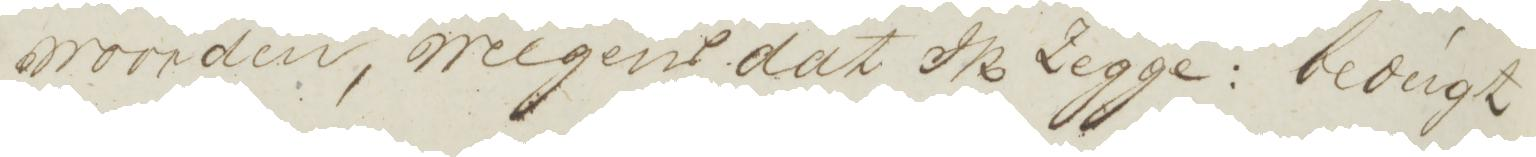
woorden, weegens dat Ik zegge: bedugt
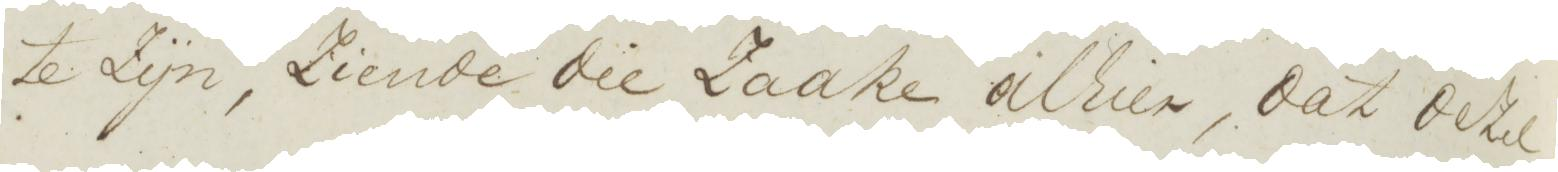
te zijn, ziende die zaake alhier, dat dezel
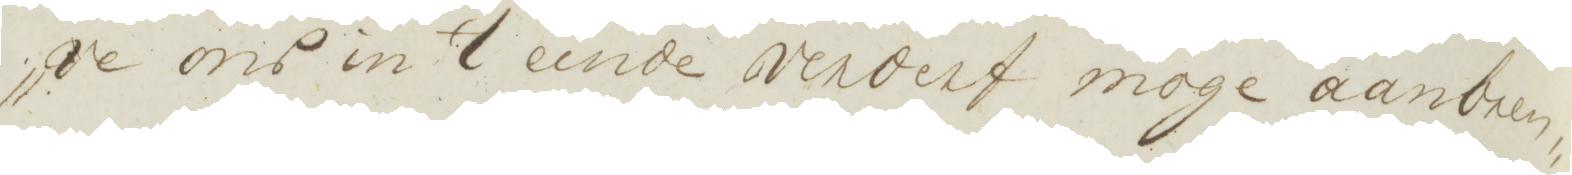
„ve ons in ’t einde verderf moge aanbren„
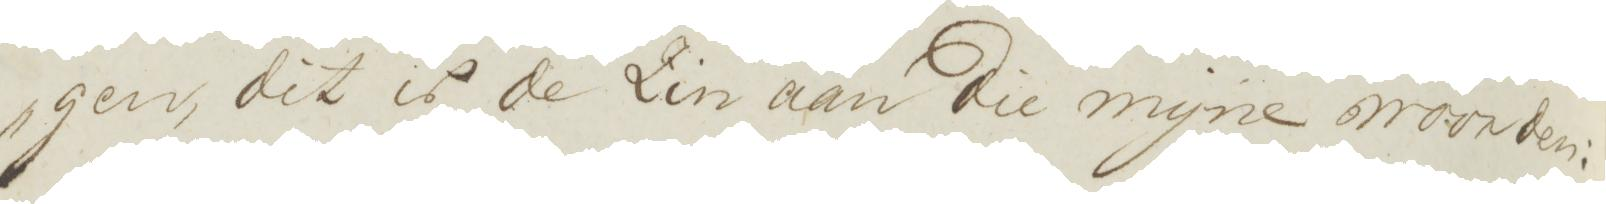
gen, dit is de Zin aan die mijne woorden:
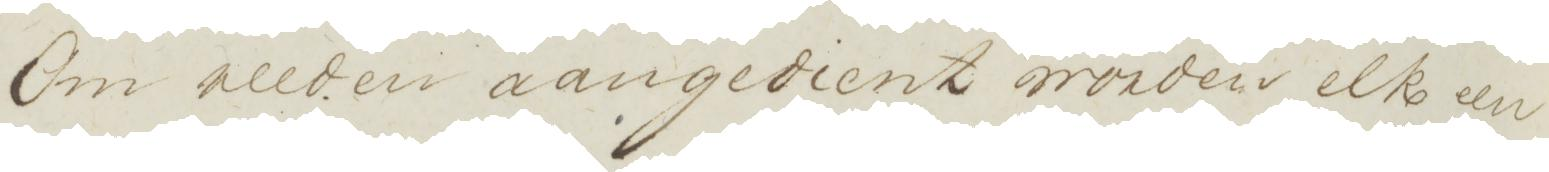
Om reeden aangedient worden elk een
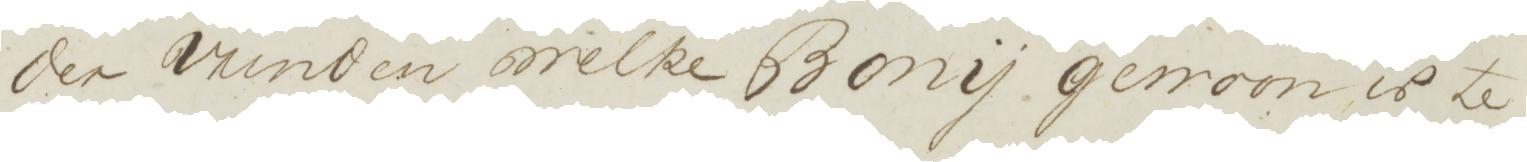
der vrinden welke Bonij gewoon is te
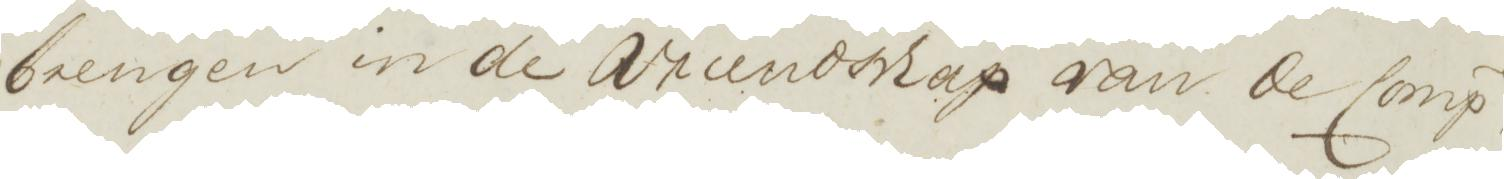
brengen in de vriendschap van de Comp„e
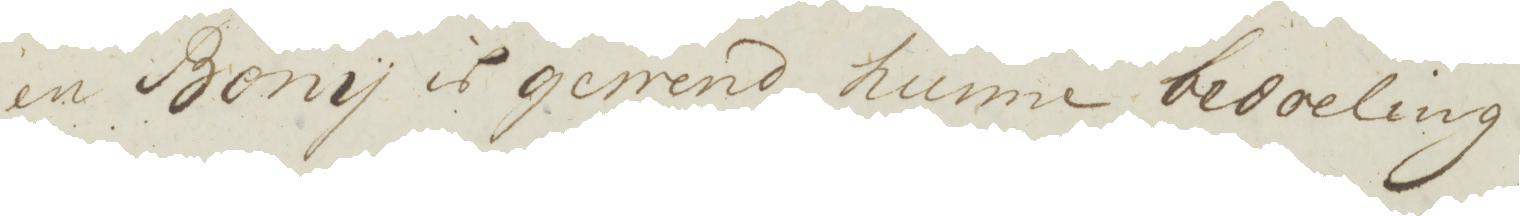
en Bonij is gewend, hunne bedoeling
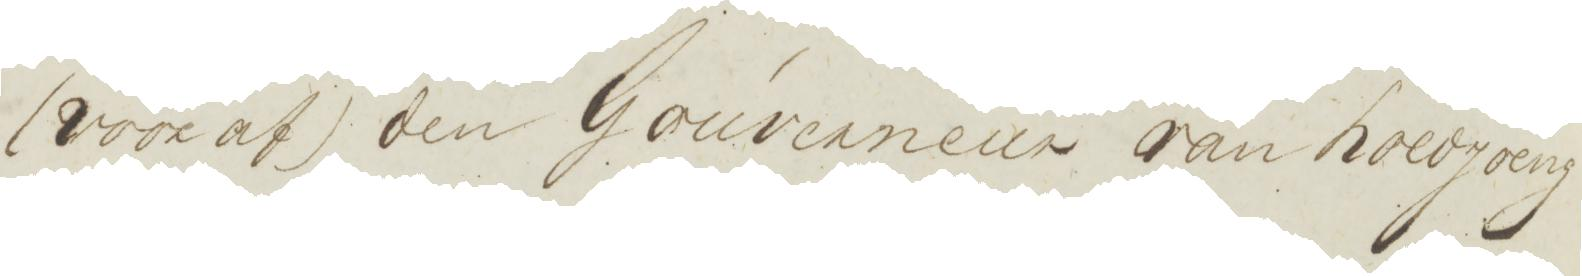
(voor af) den Gouverneur van hoedjoeng
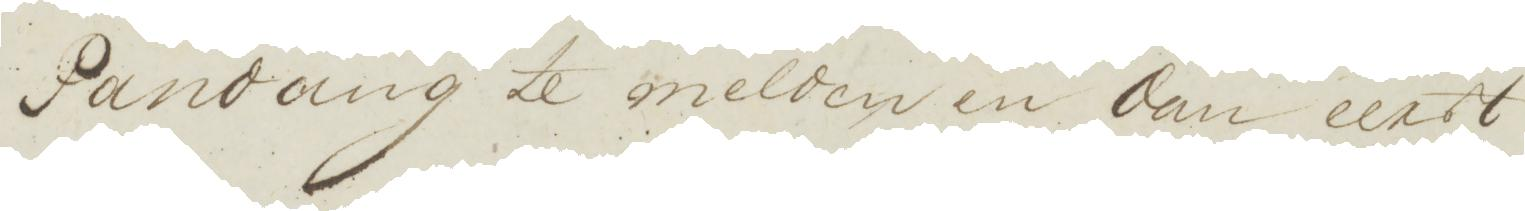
Pandang te melden en dan eerst
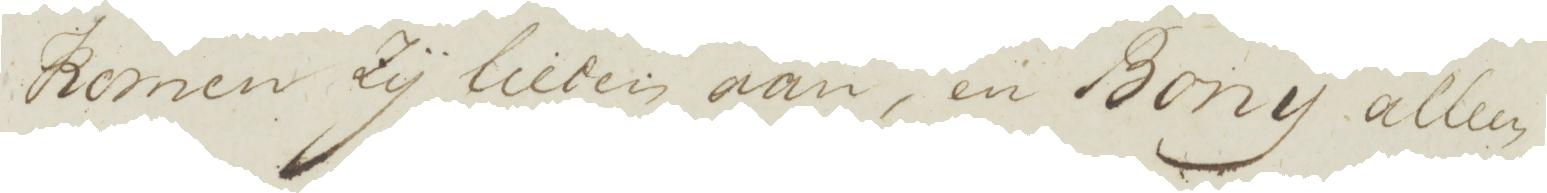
komen zij lieden aan, en Bonij alleen
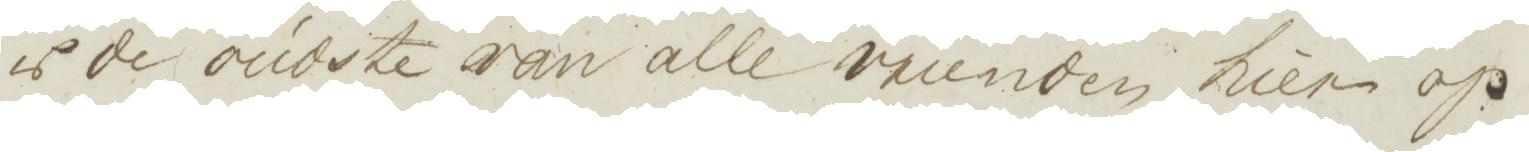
is de oudste van alle vrienden hier op
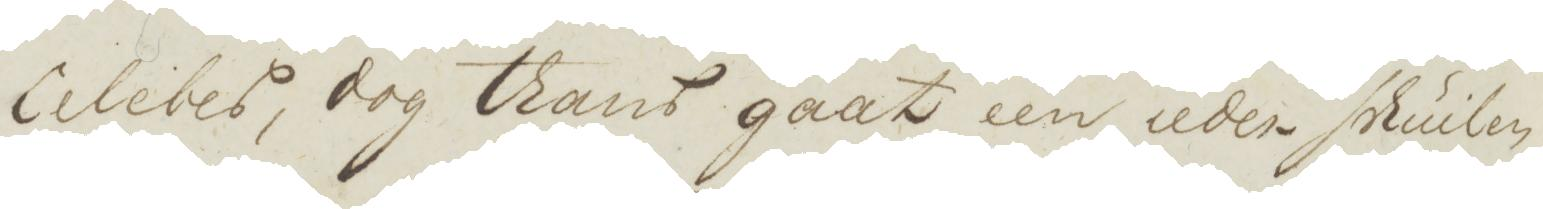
Celebes, dog thans gaat een ieder schuilen
